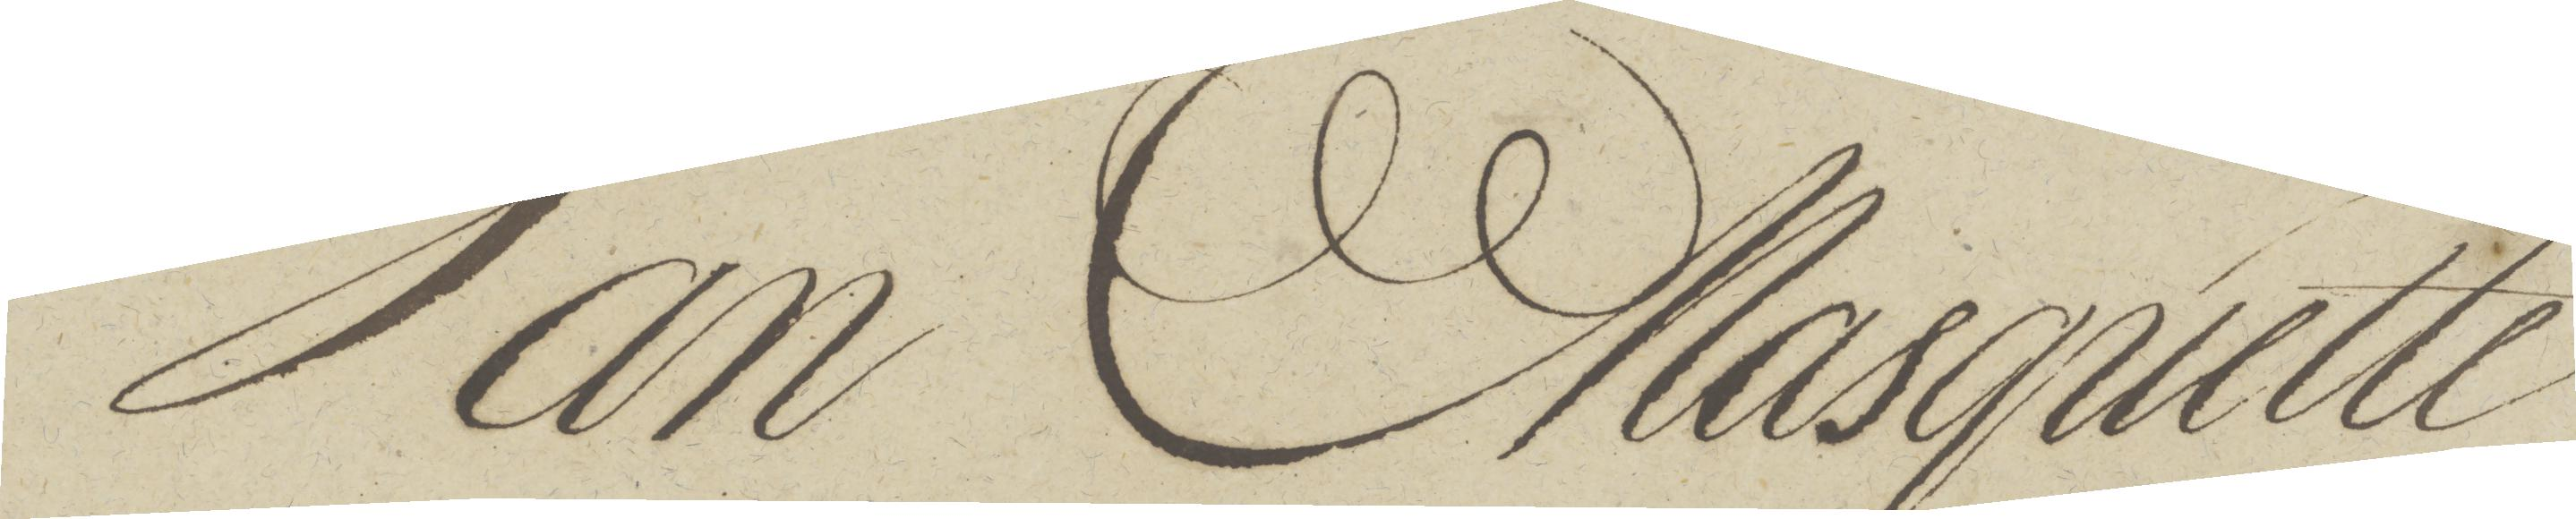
Van Masquette
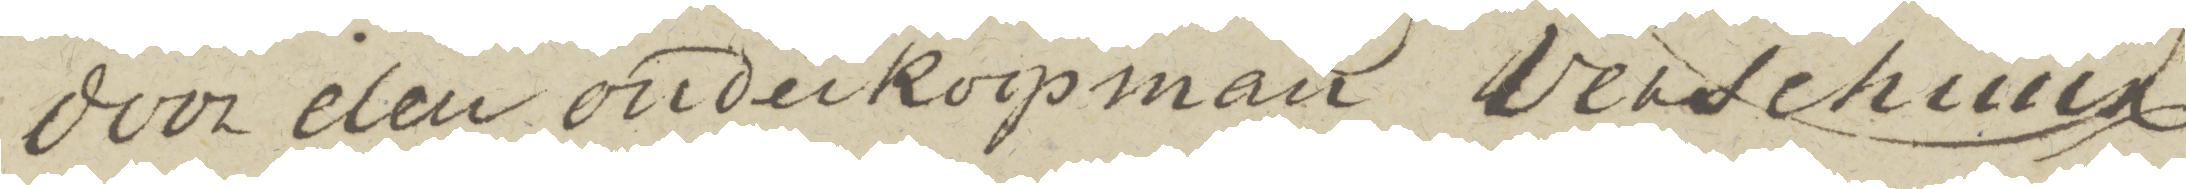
door den onderkoopman verschuur
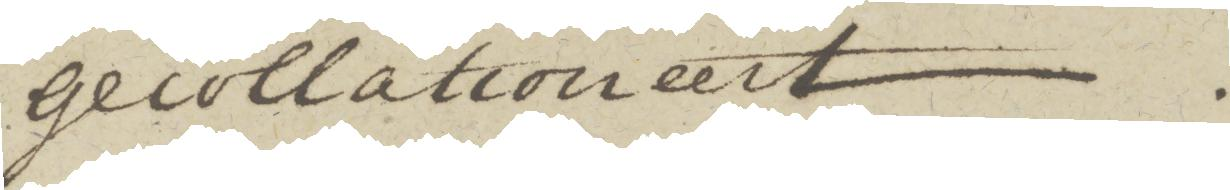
gecollationeert.
